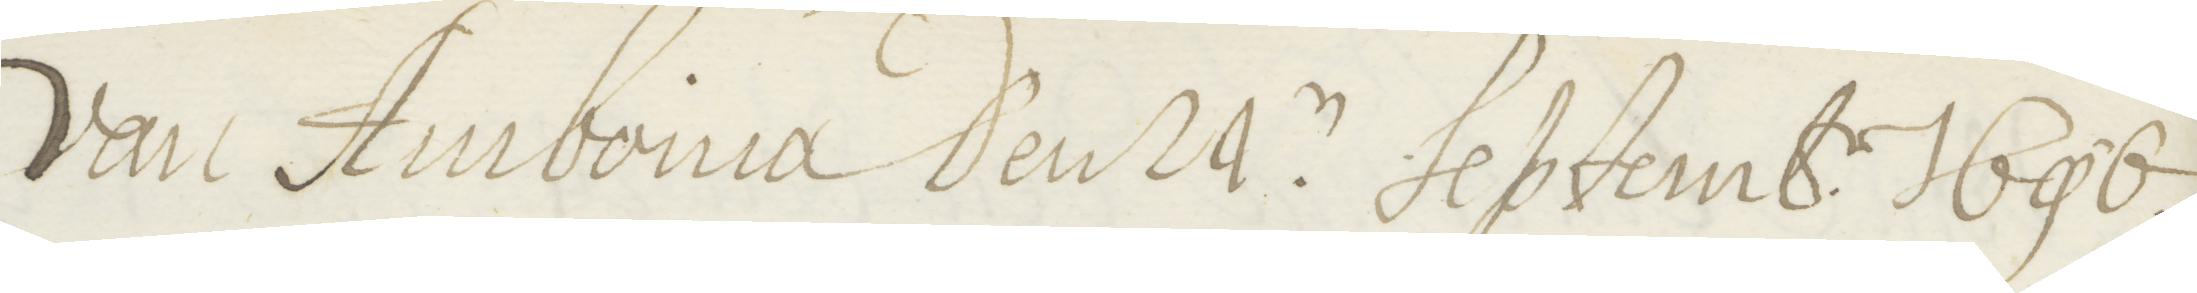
van Amboina den 24:n Septemb.r 1696.
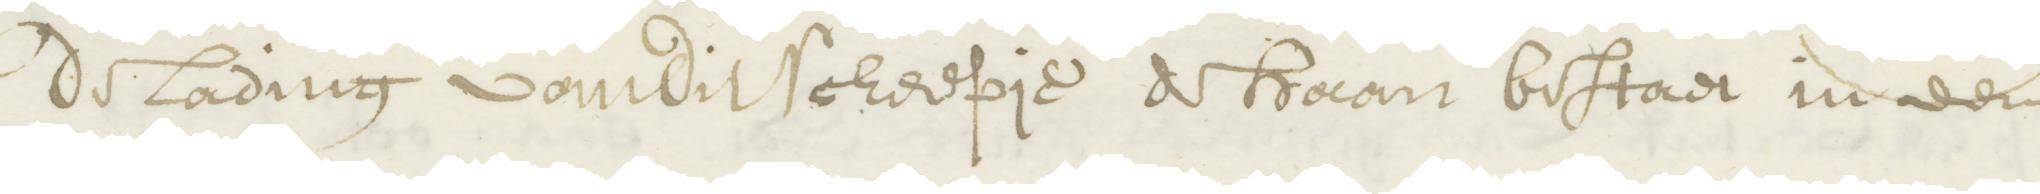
de lading van dit scheepje de haan bestaet in een
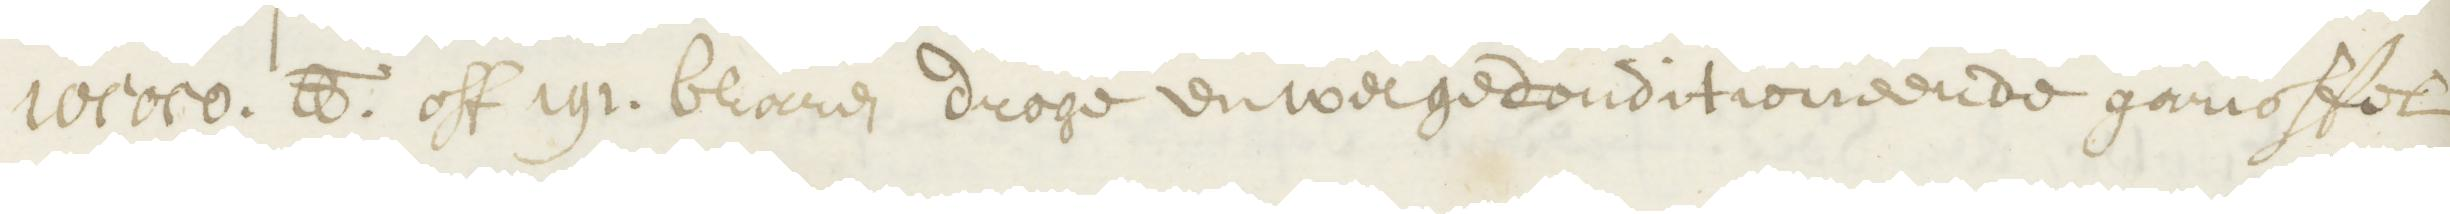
105050. lb. off 191. bharen droge en wel geconditioneende garioffel
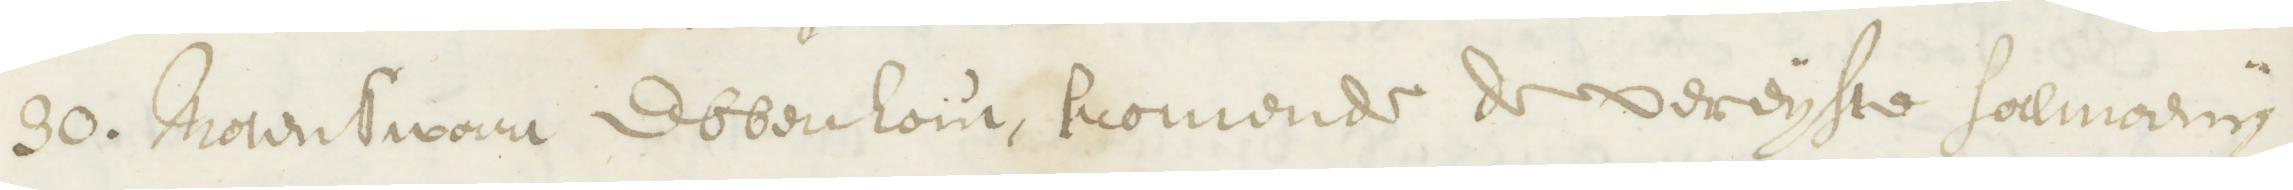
30. Moten swart Ebbenhout, komende de vereijste salmaenij
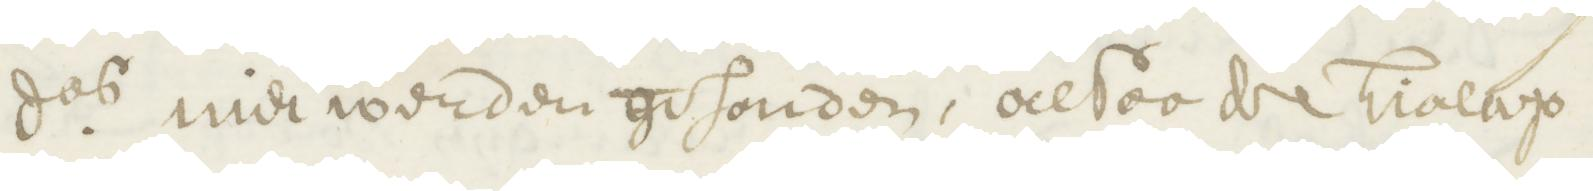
d.os niet werden gesonden, alsoo de chialap
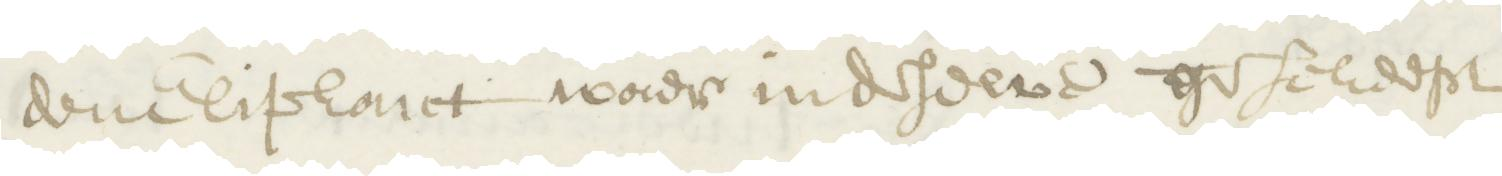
den Eliphant waer in deselve gescheept
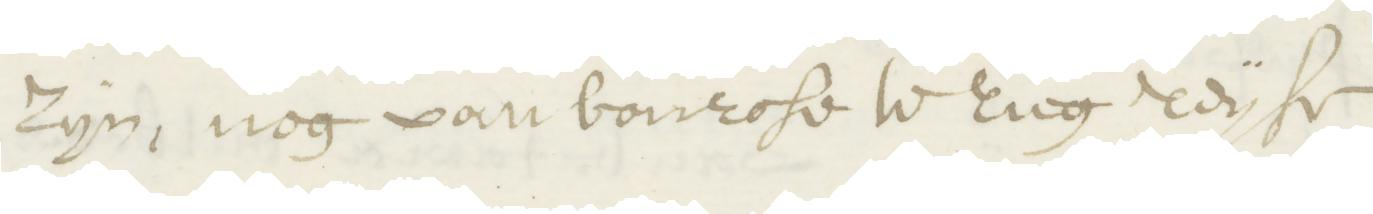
zijn, nog van bonrose te rug reijse
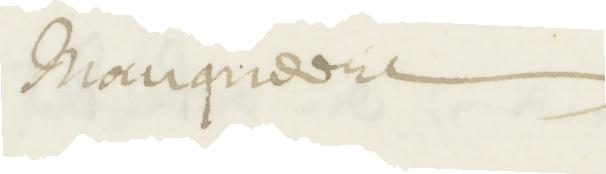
Manqueert
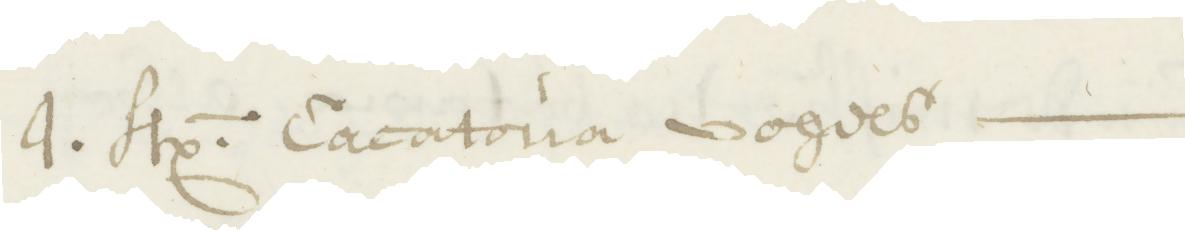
4. stx. Cacatoua vogels —
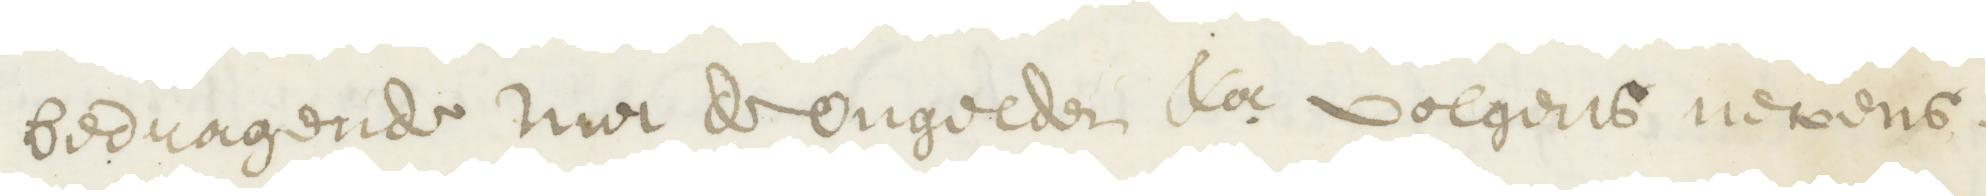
bedragende met de ongelden &.a volgens nevens
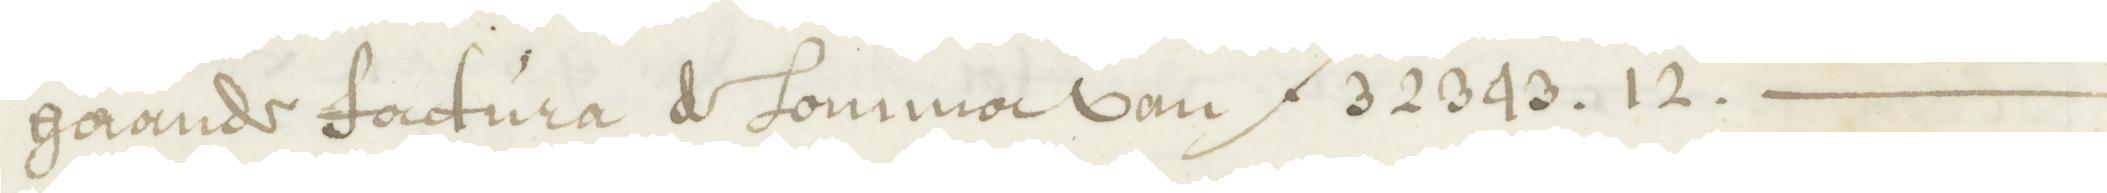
gaande factura de somma van ƒ 32343. 12. —
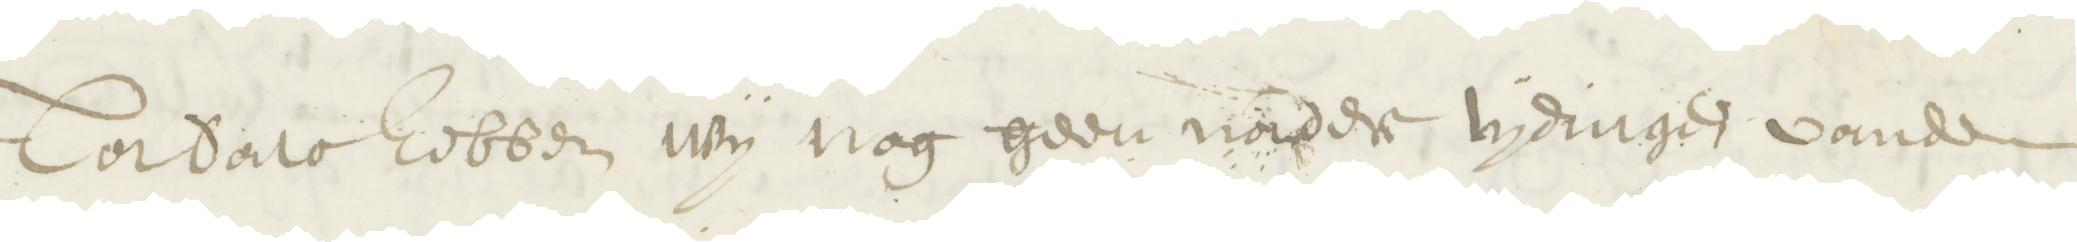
Tot dato hebben wij nog geen nader tijdinge vanden
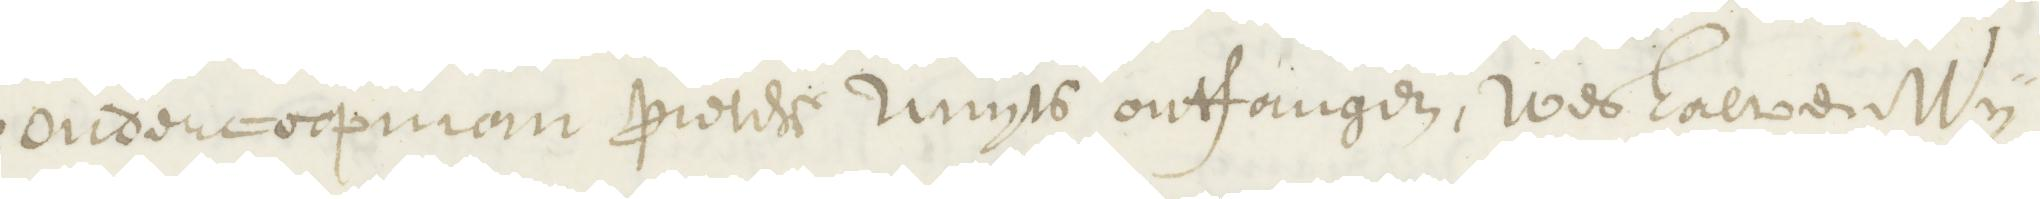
ondercoopman Pieter Nuijts ontfangen, weshalven Wij
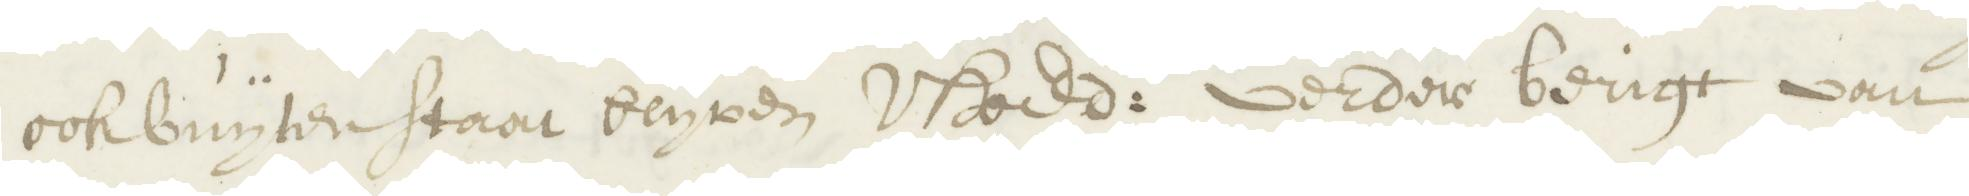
ook buijten staat blijven VHoEd: verder berigt van
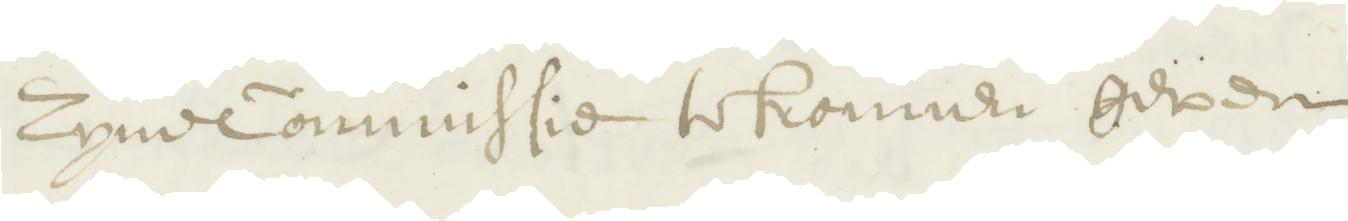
zijne Commissie tekonnen geven
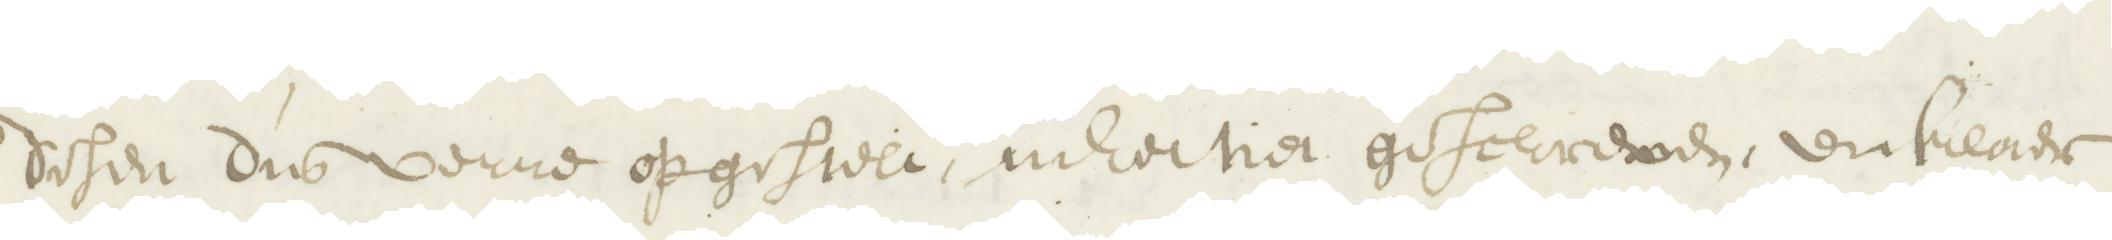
desen dus verre opgestelt, in het Net geschreven, en klaer
